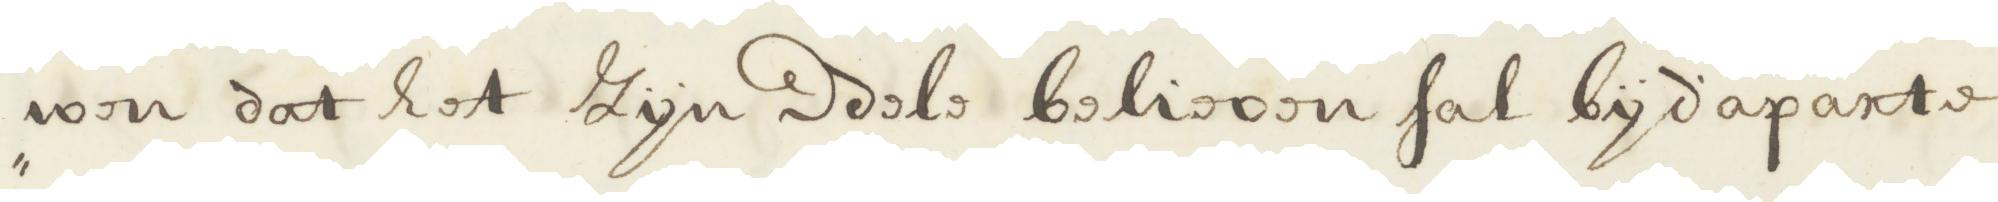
„wen dat het zijn Edele believen sal bijd'aparte
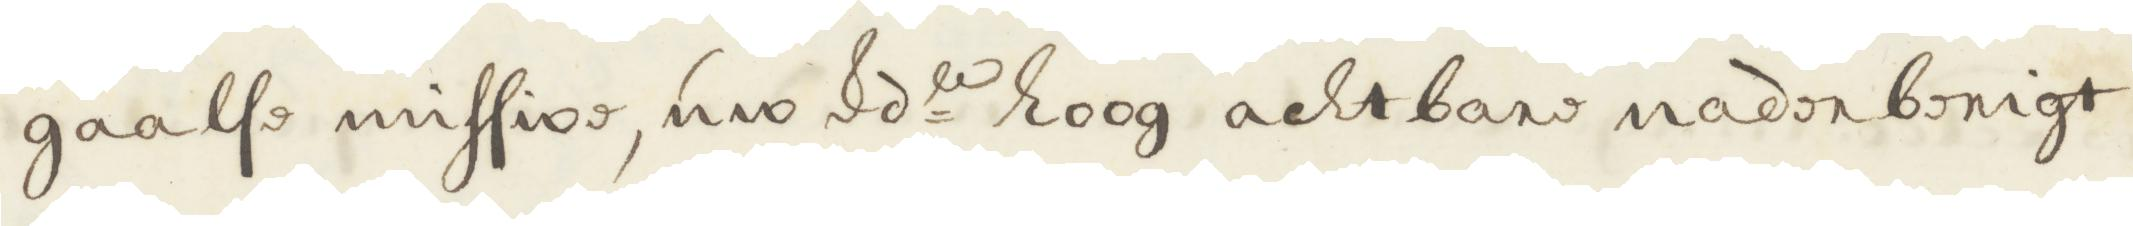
gaalse missive, uw Ed=le hoog achtbare nader berigt
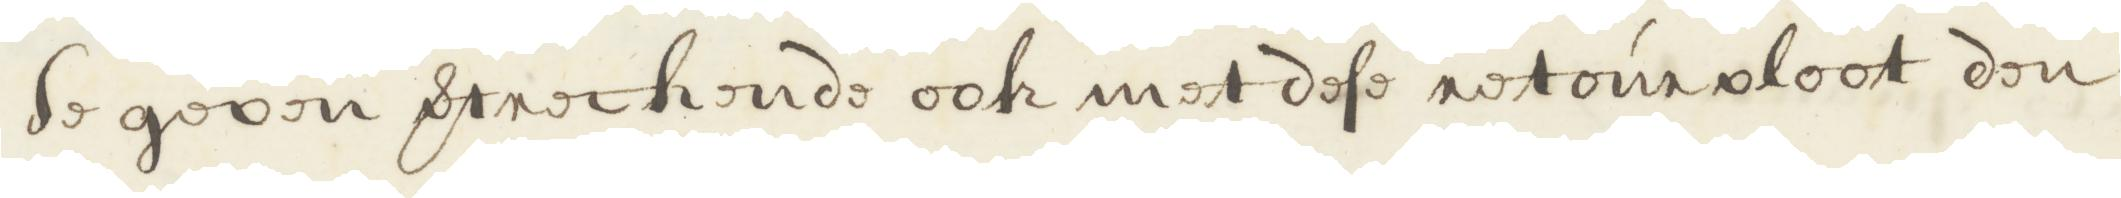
te geven vertreckende ook met dese retour vloot den
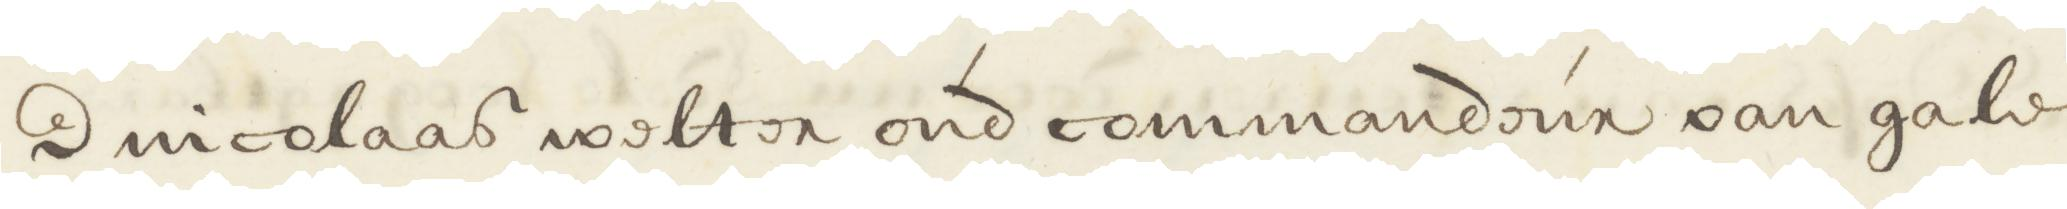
E nicolaas welter oud commandeur van gale
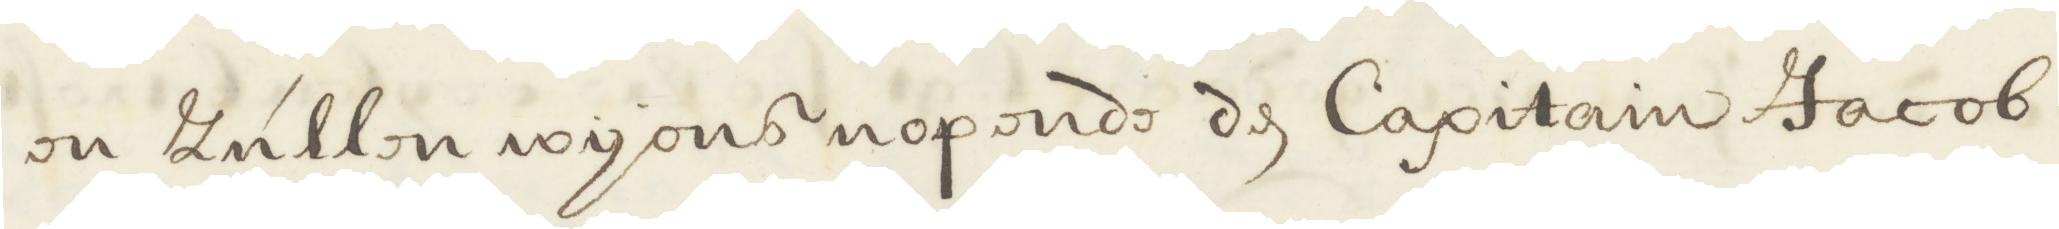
en zullen wijons nopende den Capitain Iacob
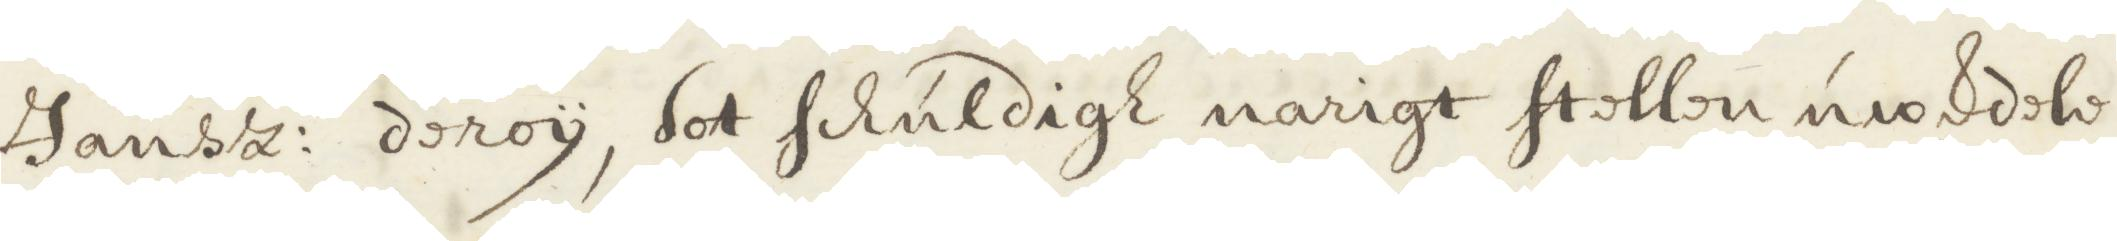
Iansz: deroij, tot schuldigh narigt stellen uw Edele
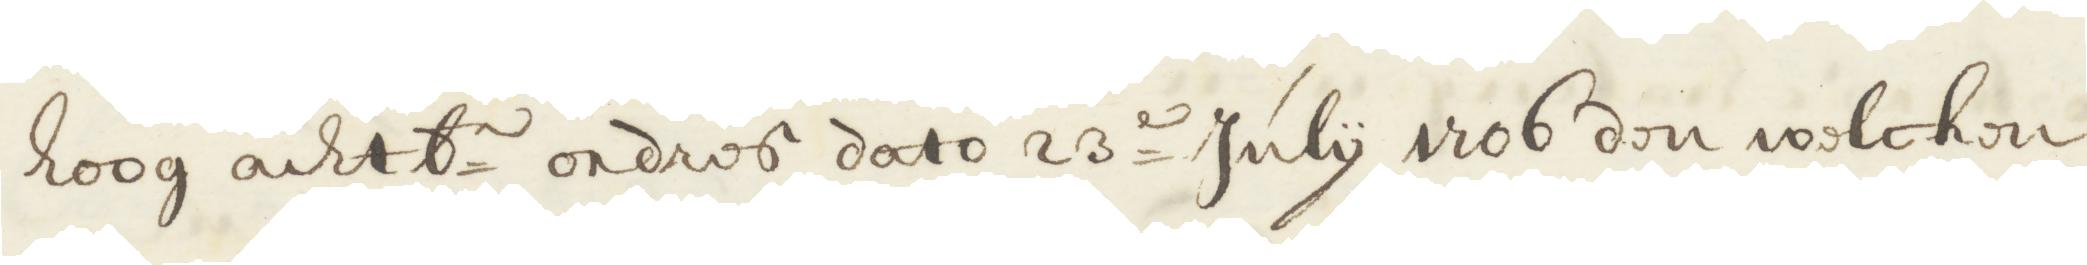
hoog achtb=r ordres dato 23=e Julij 1706 den welcken
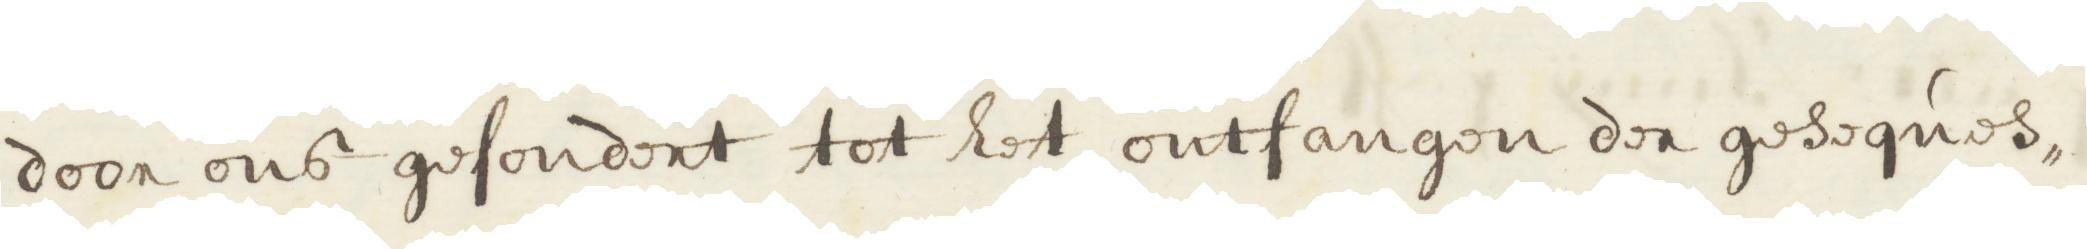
door ons gesondert tot het ontfangen der geseques„
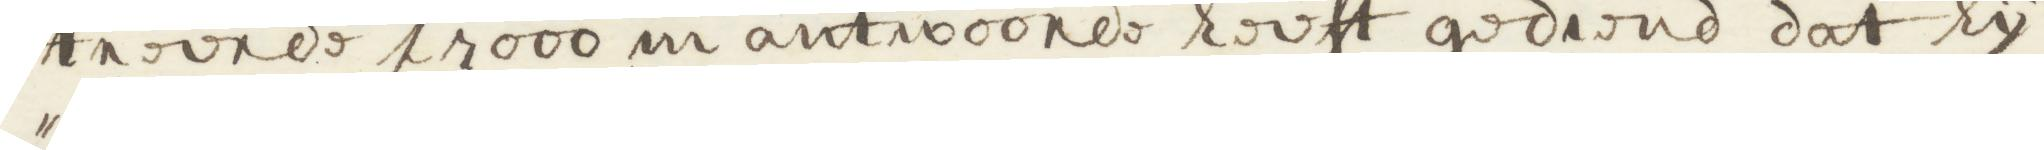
„treerde ƒ7000 in antwoorde heeft gediend dat hij
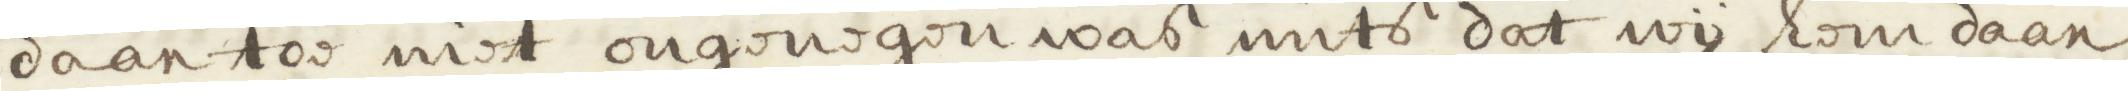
daar toe niet ongenegen was mits dat wij hem daar
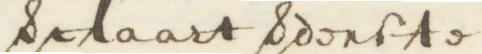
verclaart verders te
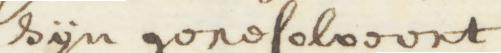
sijn geresolveert
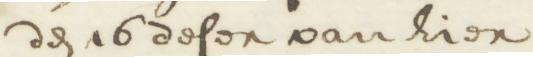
den 16 deser van hier
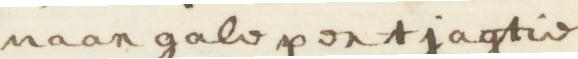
naar gale per t jagtie
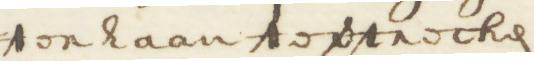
ter haar tevertrecken
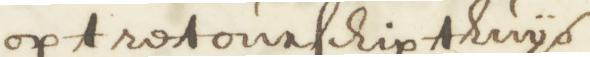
op ’t retour schip t huijs
